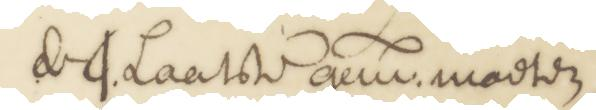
de 4. laatste gem: moeten
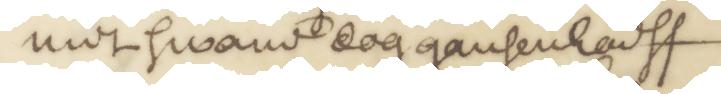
niet sware dog gansenhoeff
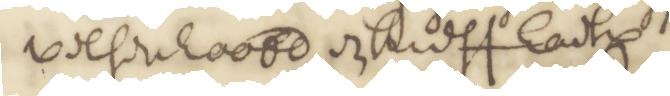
velserhoofd, en kieff hoek
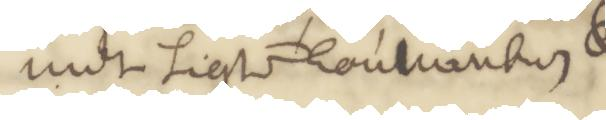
met ligte houtwerken
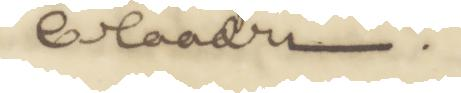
belaaden.
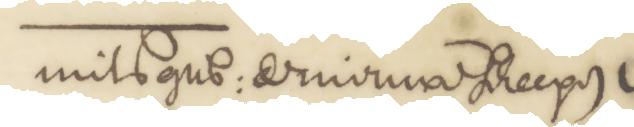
mitsgrs: de nieuwe scheepen
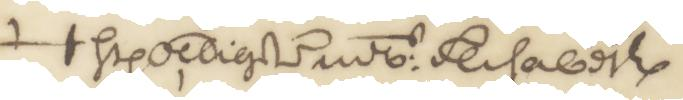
't tspoedigste nev:s Elisabeth
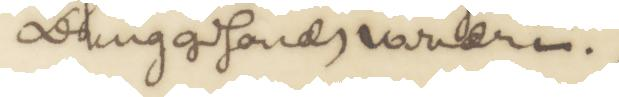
terug gesonden werden.
